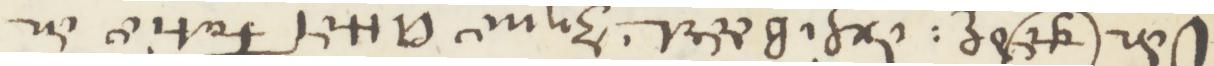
Den gedh:e exhibeert zijne attestatie en
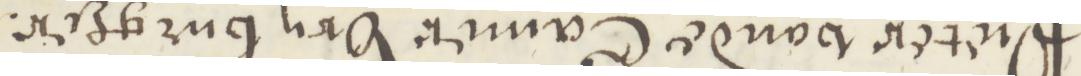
Pieter vande Camer vrij burgher.
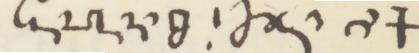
te exhibeeren
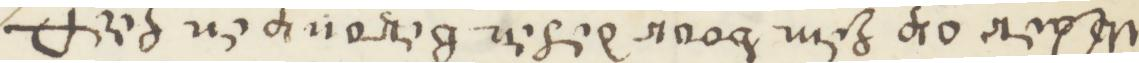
waer op hem voor desen beroupen heeft
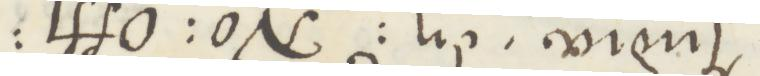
India, Eij:r No: Offj:e
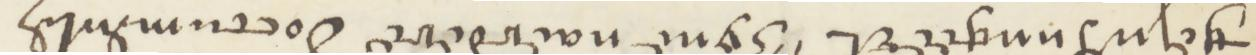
gejniungeert zijne naerdere documenten
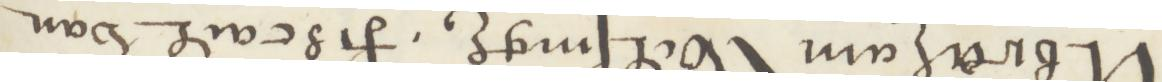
Abraham Welsingh, fiscael van
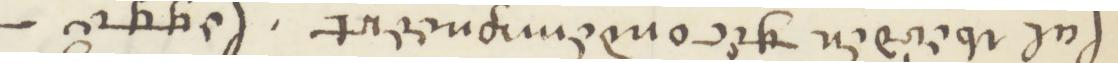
sal werden gecondempneert, segge
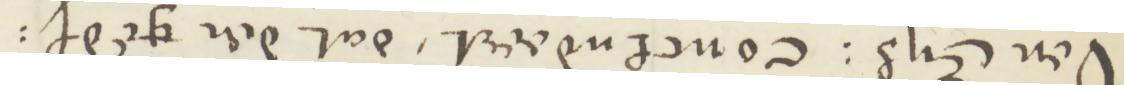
Den Eijs:r concludeert, dat den gedh:e
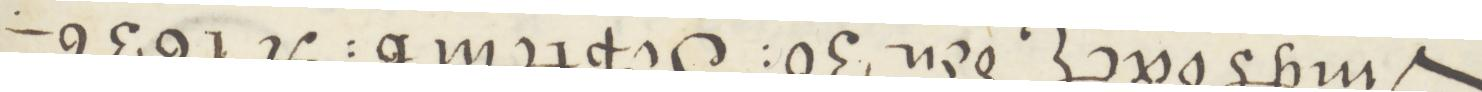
Dingsdach den 30:e Septemb:r Ao 1636–
